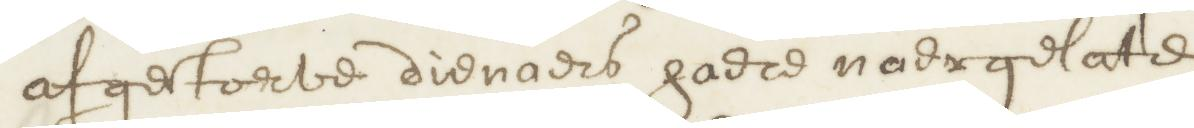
afgestorve dienaers haere naergelate
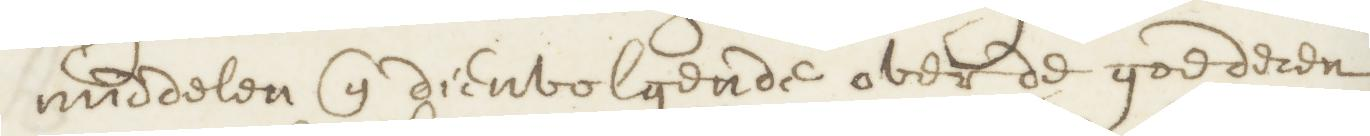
middelen ende dienvolgende over de goederen
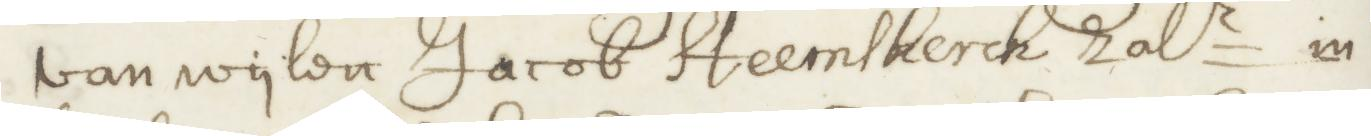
van wijlen Jacob Heemskerck zal=r in
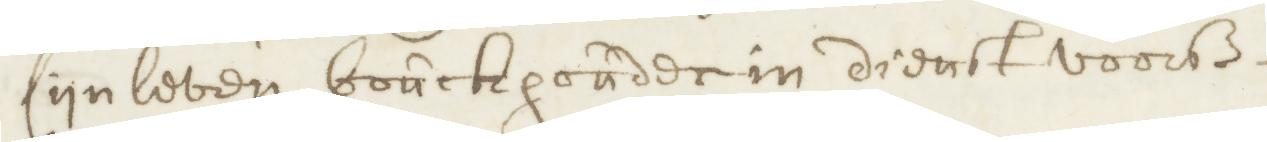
sijn leven bouckhouder in dienst voorsz
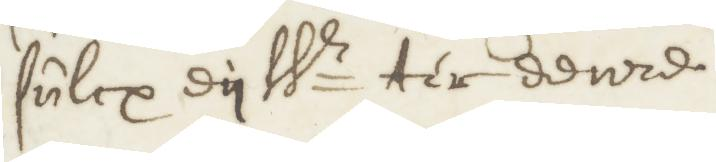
sulcx eijss=r ter eenre
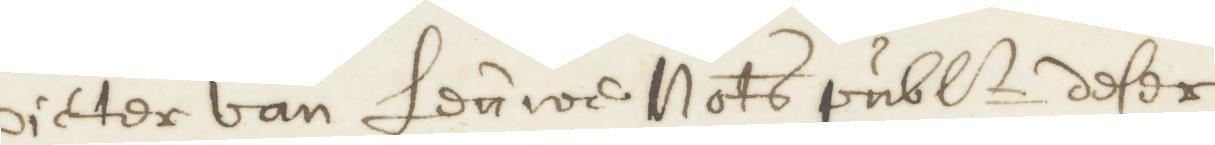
Pieter van Leuwe Nots publijk deser
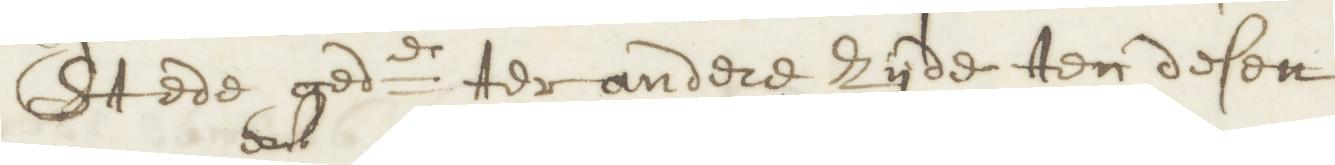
Stede ged=t ter andere zijde ten desor
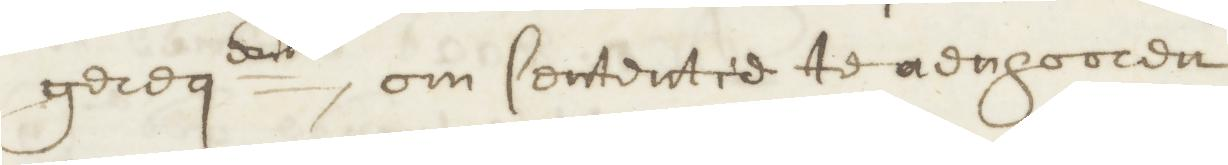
gereq=en, om sententie te aenhooren
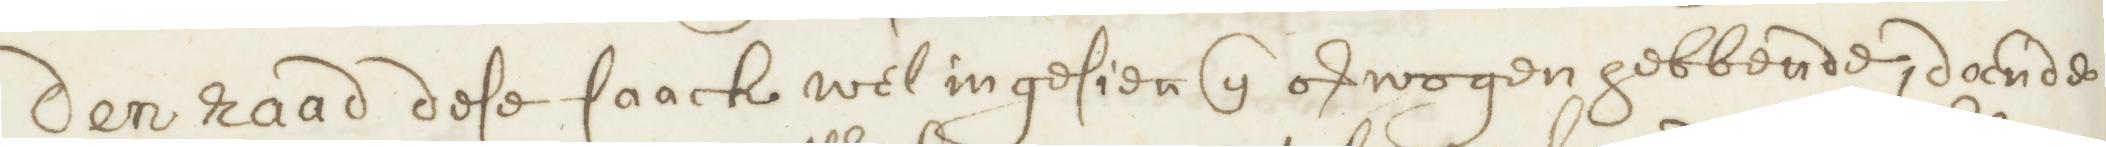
den raad dese saack wel in gesien ende overwogen hebbende, doen de
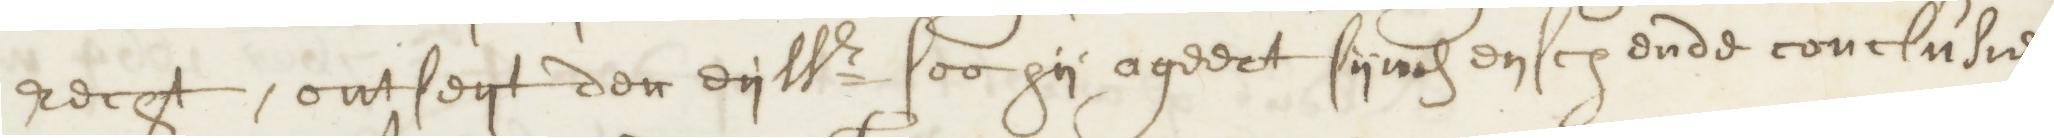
recht, ontseyt der eijss=r soo hij ageert sijne eysch ende conclusie
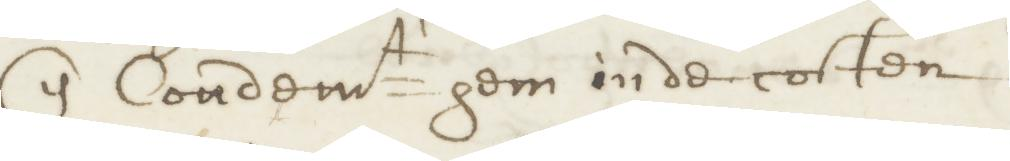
ende Condem=t hem in de costen
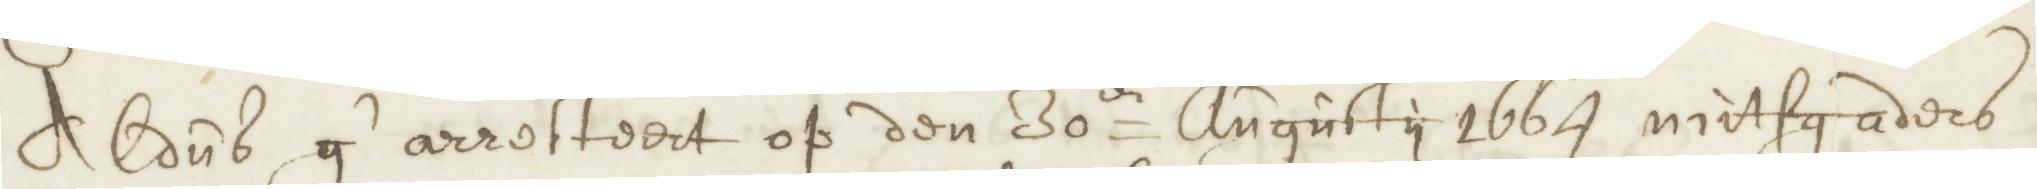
Aldus g’ arresteert op den 30=e Augustij 1664 mitsgaders
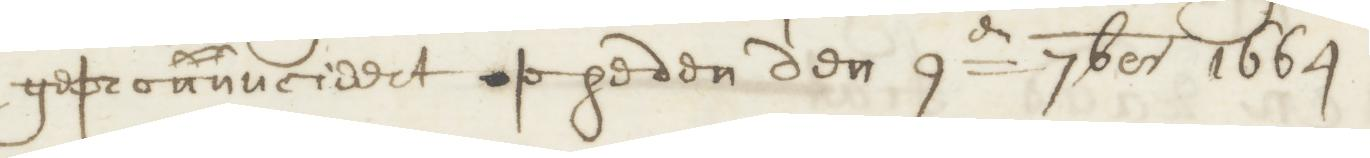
gepronuncieert op heden den 9=en 7ber 1664
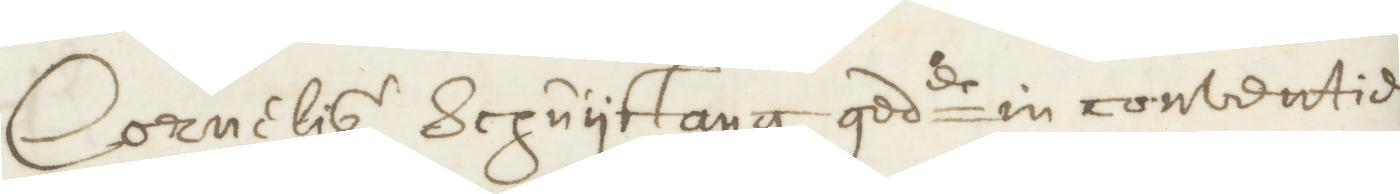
Cornelis schuijttang ged=e in conventie
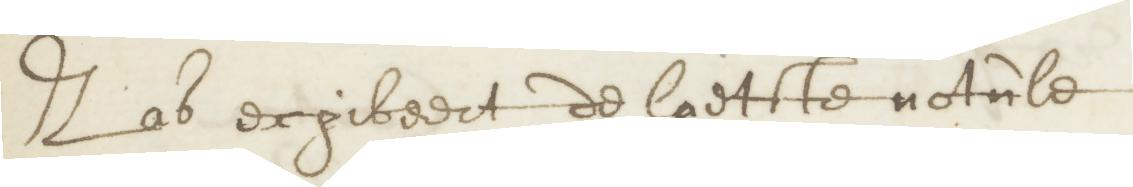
Zas exhibeert de laetste notule
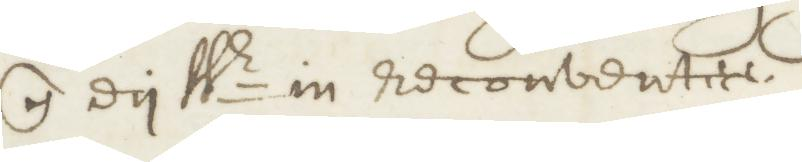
ende eijss=r in reconventie.
